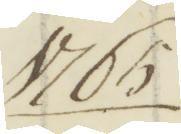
1765
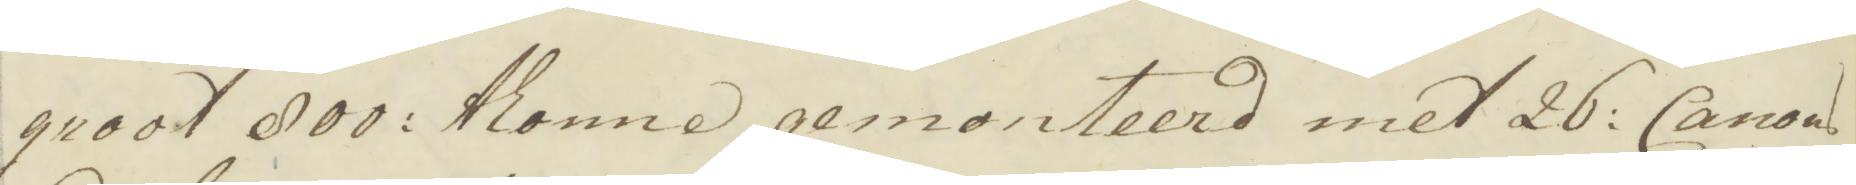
groot 800: thonne gemonteerd met 26: Canons
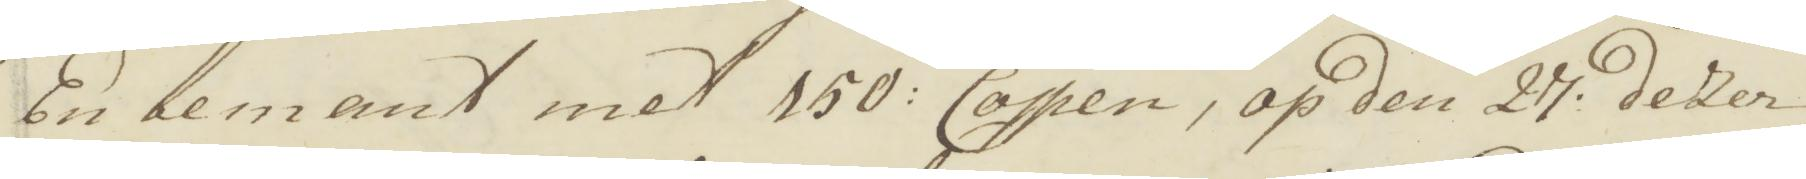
En bemant met 150: Coppen, op den 27: dezer
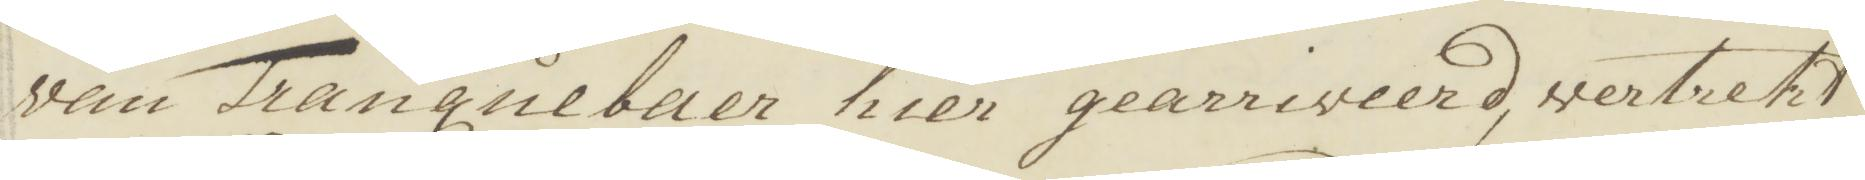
van Tranquebaer hier gearriveerd, vertrekt
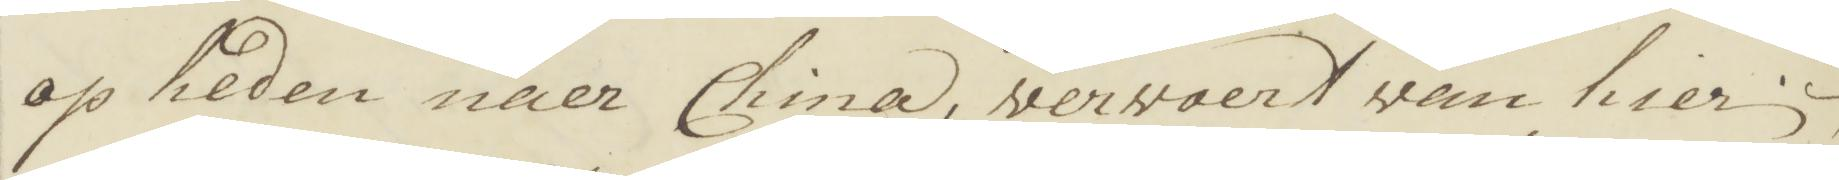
op heden naer China, vervoert van hier
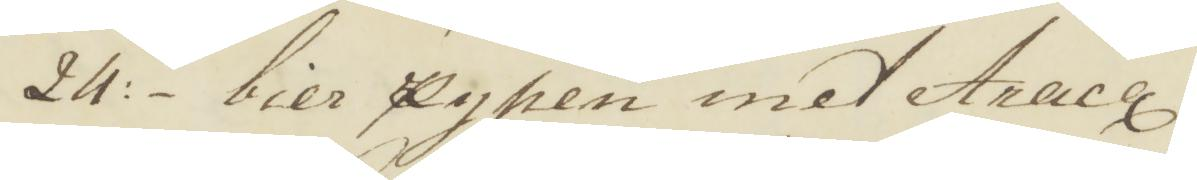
24: – bier pypen met Aracq:
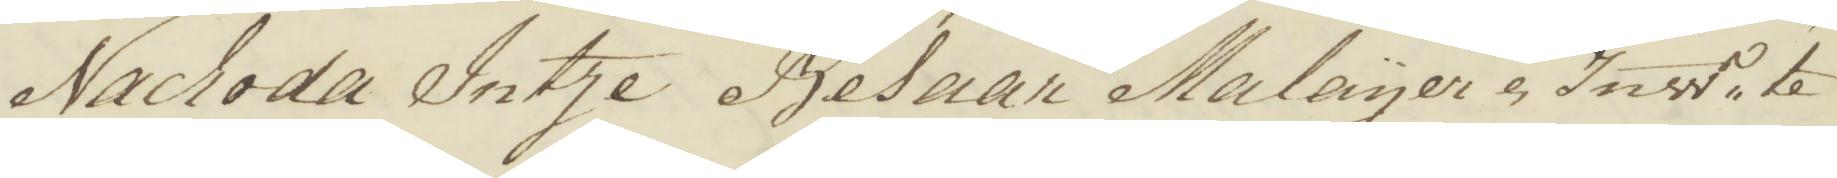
Den: 30: Aug=s Nachoda Intje Besaar Malaijer en Inw„r te
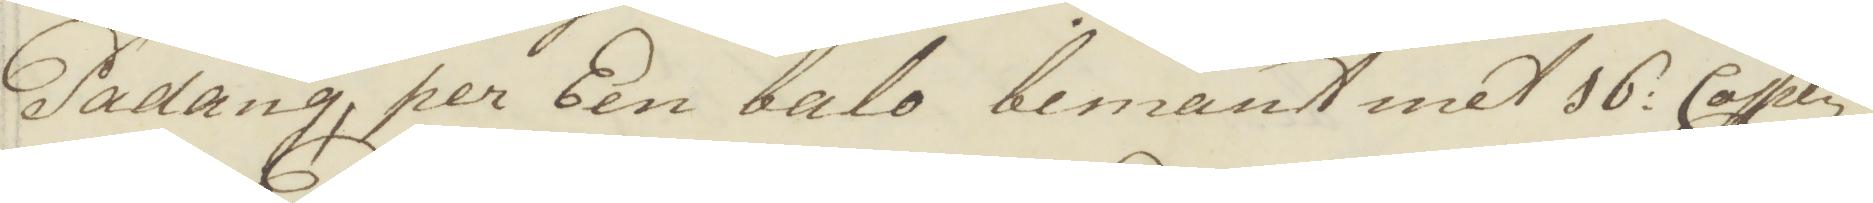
Padang, per Een balo bemant met 16: Coppen
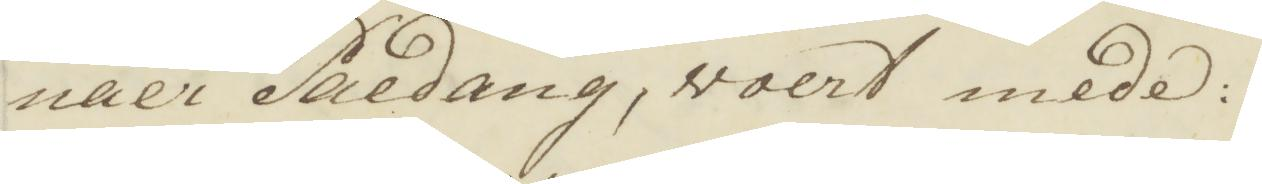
naer Paedang, voert mede:
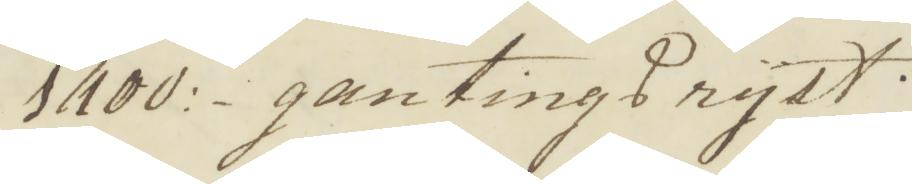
1400: - gantings rijst
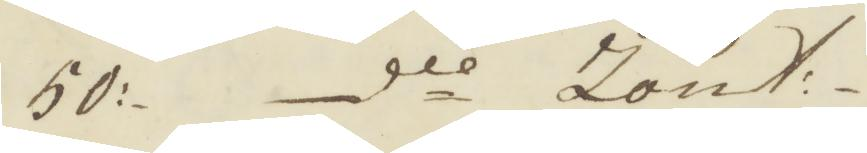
50: - _=o zout:
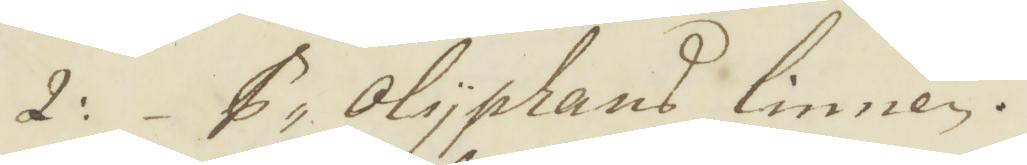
2: - p„s olijphans linnen
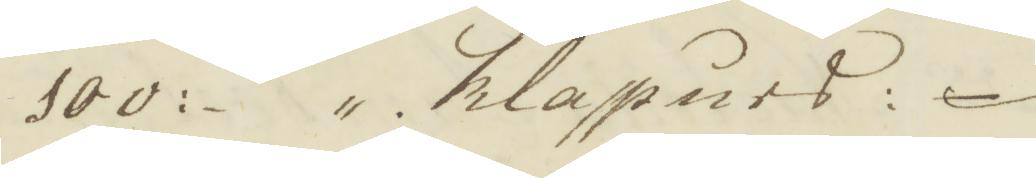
100: - „ klappurs:
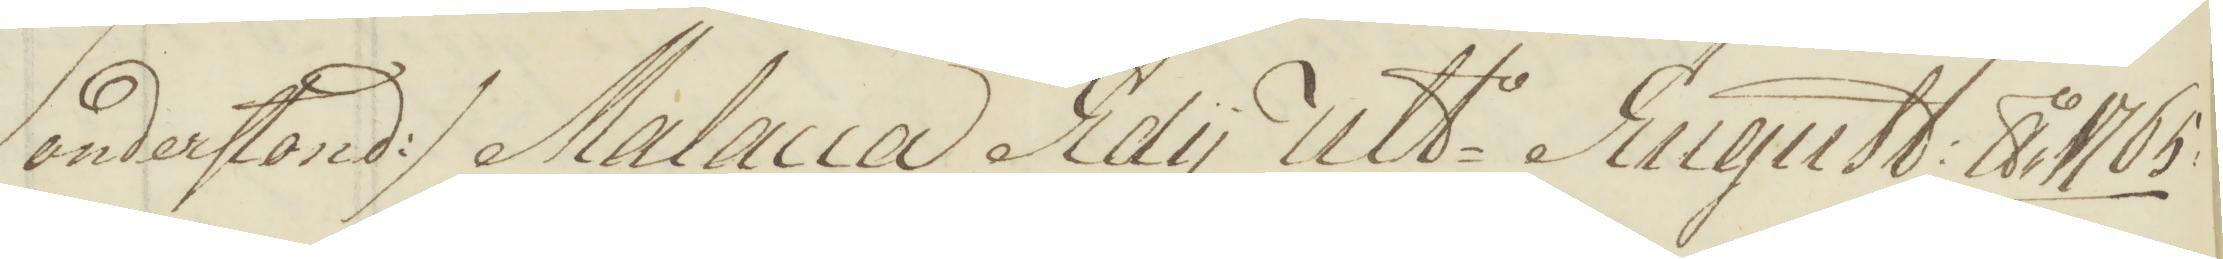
/onderstond:/ Malacca Adij ult=o August: a„o 1765:
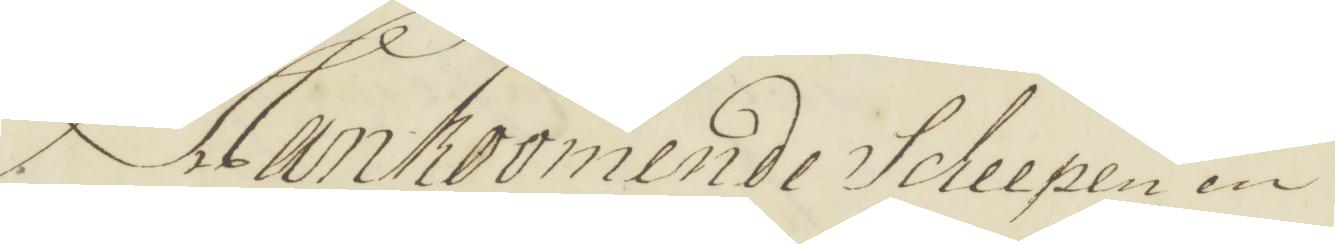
Aankoomende Scheepen en
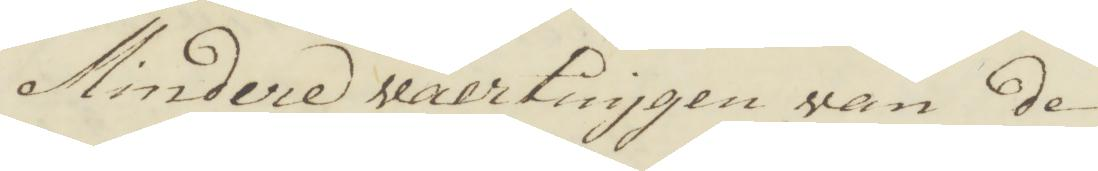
Mindere vaertuijgen van de
